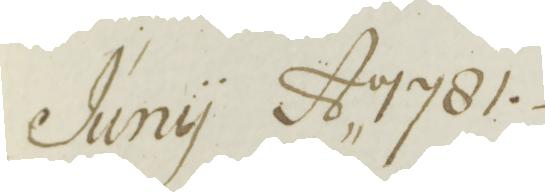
Iunij A„o 1781.
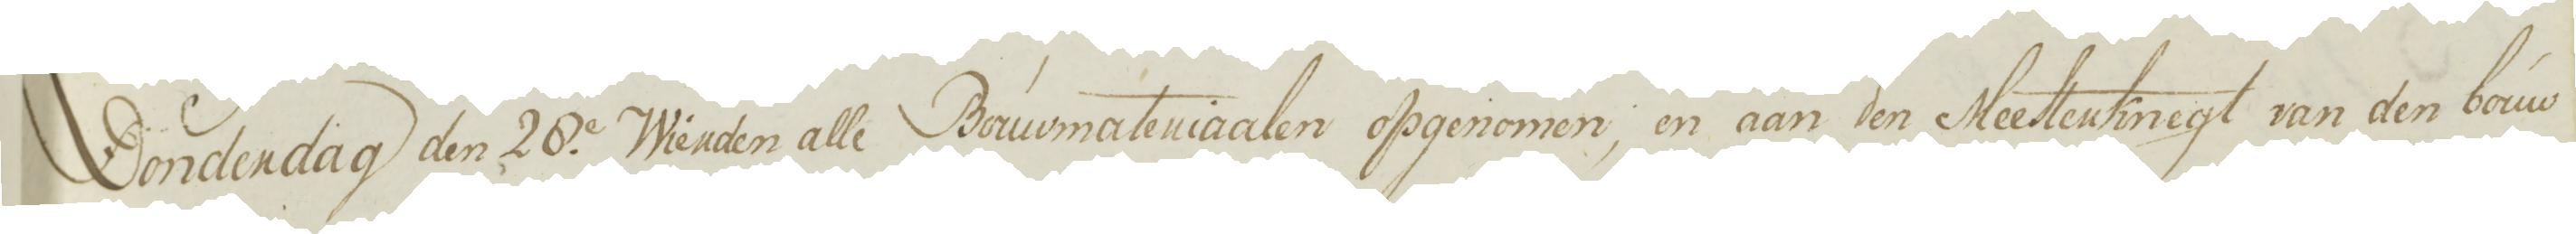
Donderdag den 28:e Wierden alle Bouwmateriaalen opgenomen, en aan den Meesterknegt van den bouw
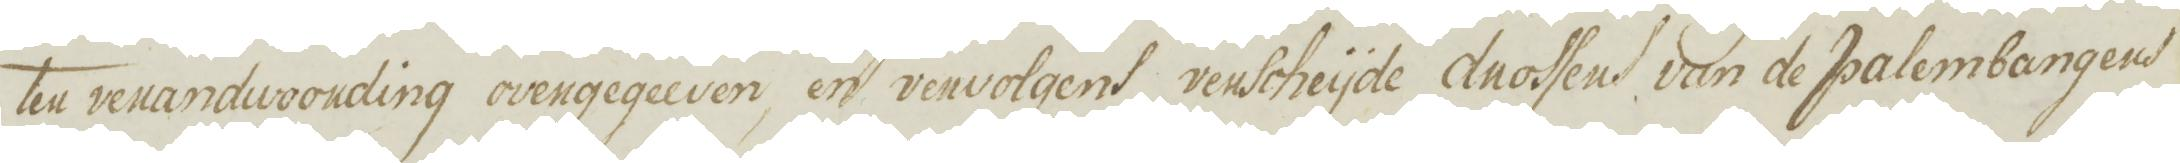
ten verandwoording overgegeeven, en vervolgens verscheijde drossens van de Palembangers
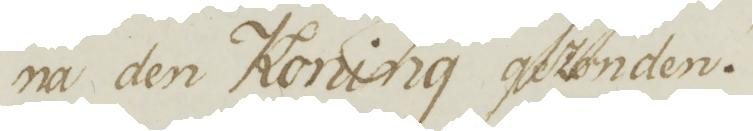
na den Koning gezonden.
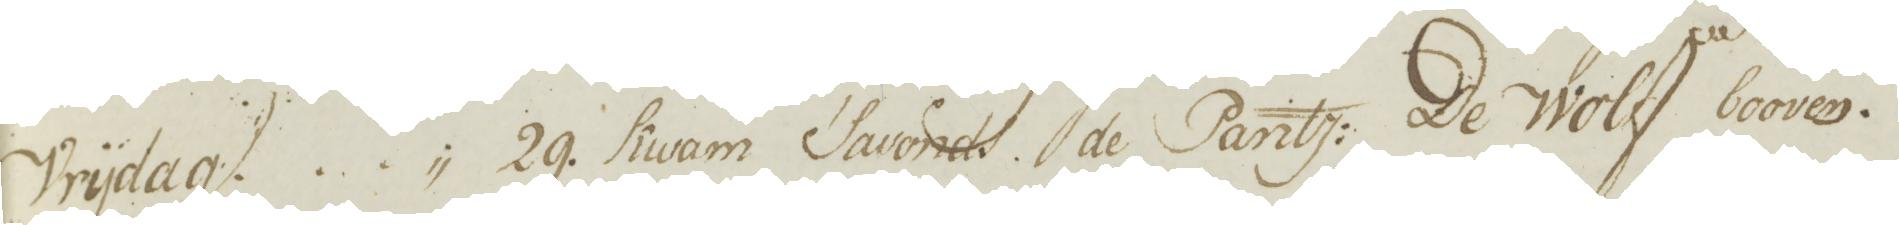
Vrijdag . . . „ 29. kwam 'savonds. de Pantj: De Wolf booven.
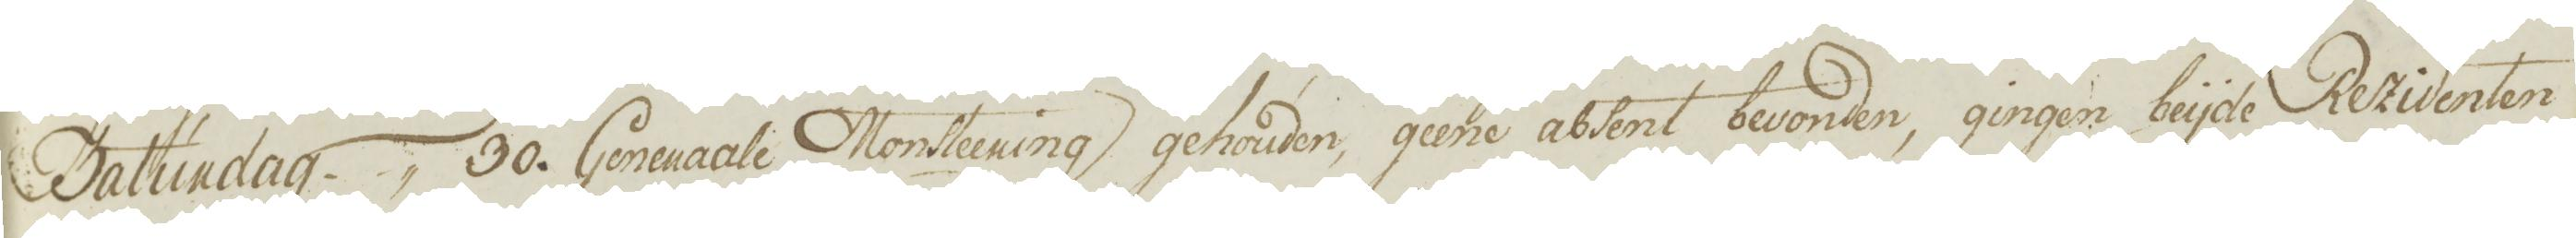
Saturdag - - „ 30. Generaale Monsteering gehouden, geene absent bevonden, gingen beijde Rezidenten
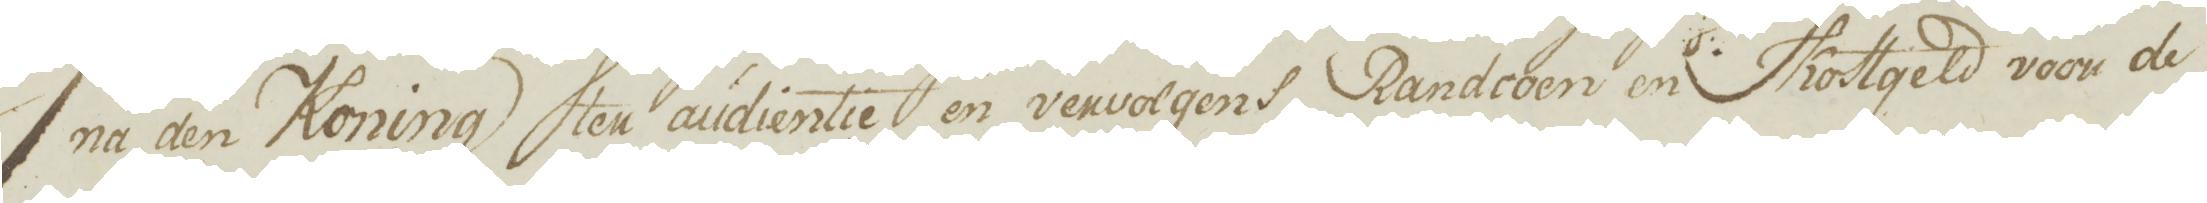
na den Koning ter audientie en vervolgens Randcoen en kostgeld voor de
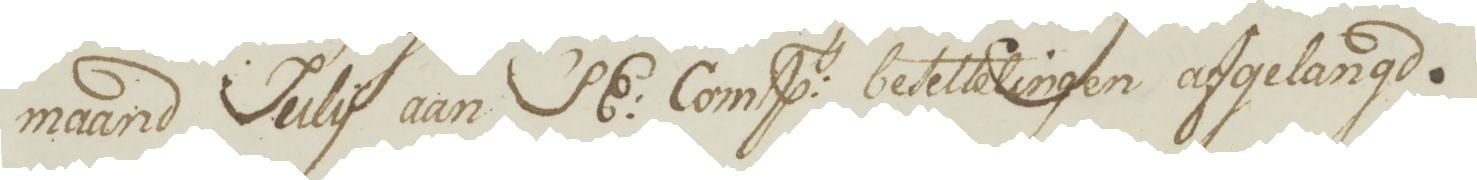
maand Iulij aan 'sE: Comp:s besettelingen afgelangd.
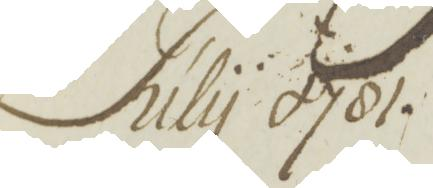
Iulij 1781.
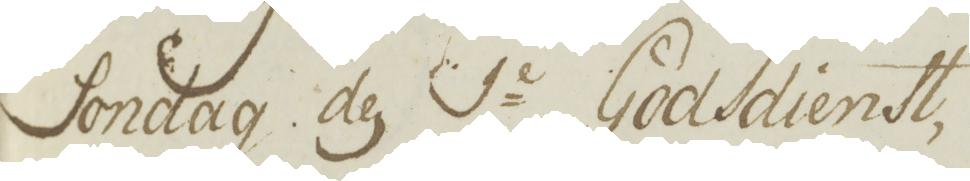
Sondag den 1=e Godsdienst,
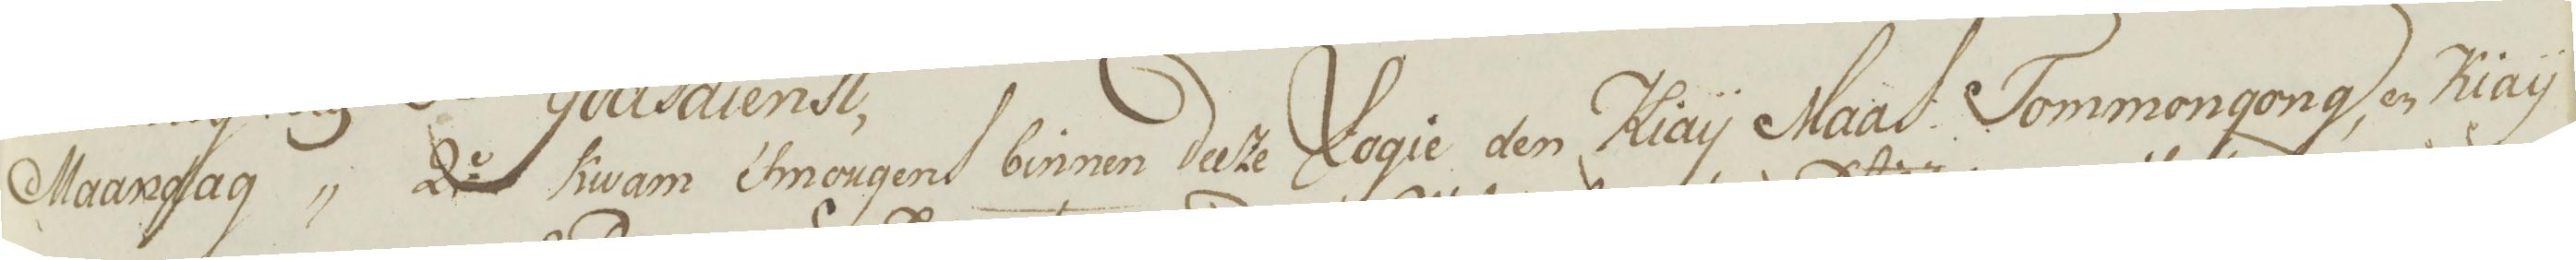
Maandag „ 2=e kwam 'smorgens binnen deeze Logie den Kiaij Maas Tommongong, en Kiaij
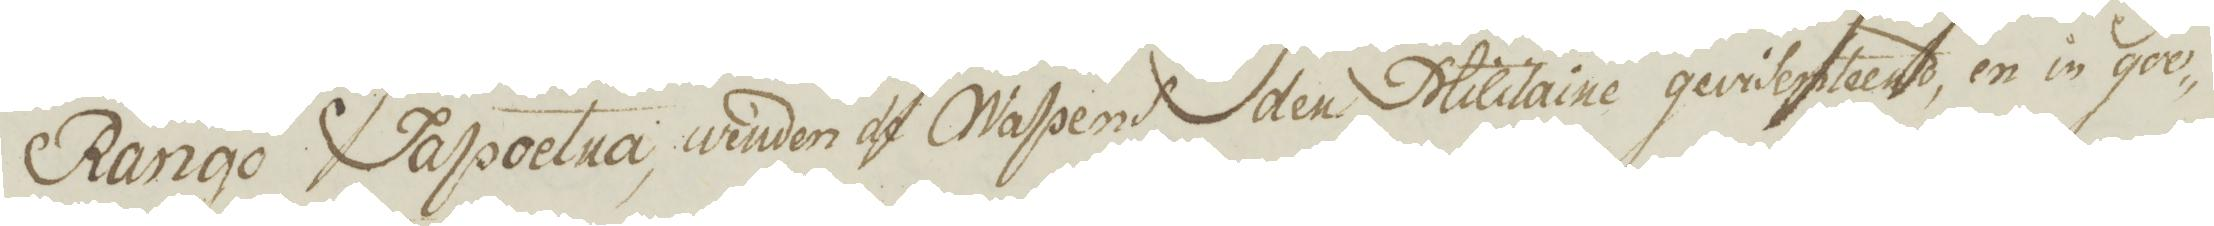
Rango Iapoetra, wierden de Wapens den Militaire gevisenteerd, en in goe„
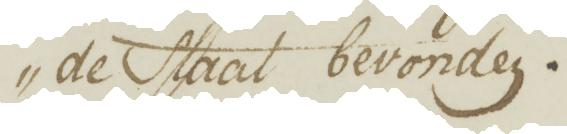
„de staat bevonden.
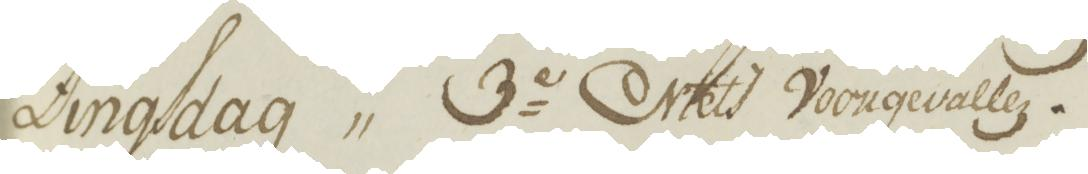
Dingsdag „ 3=e Niets Voorgevallen.
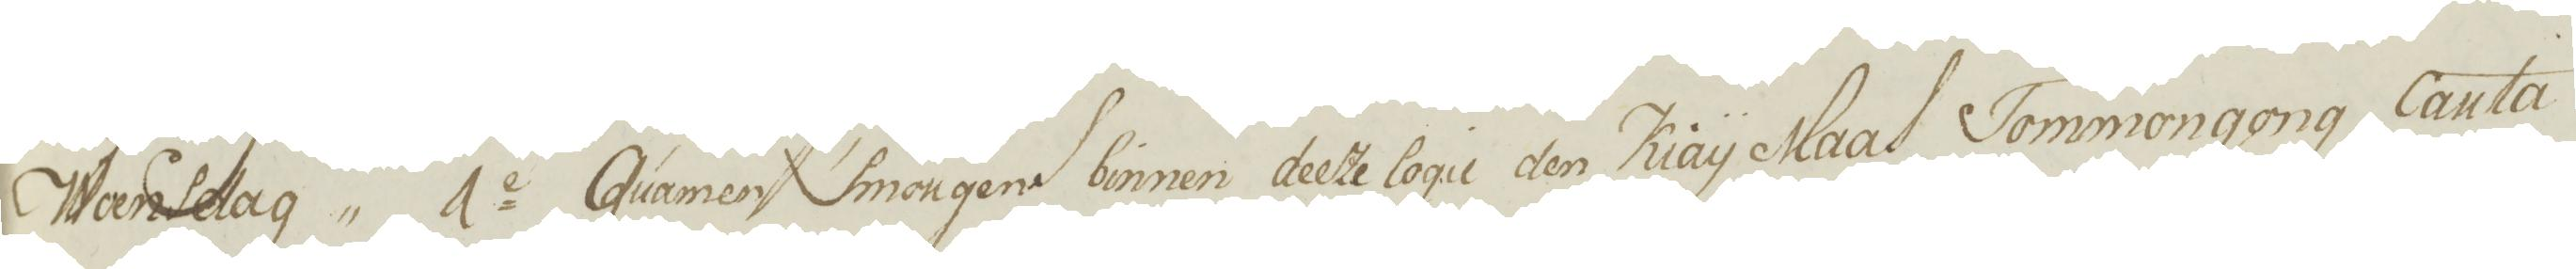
Wansdag „ 4=e Quamen 'smorgens binnen deeze logie den Kiaij Maas Tommongong, Carta
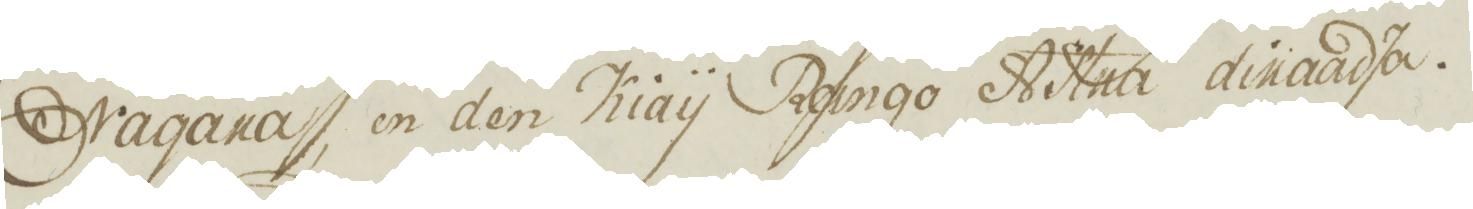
Nagara, en den Kiaij Rango Astra diraadja.
